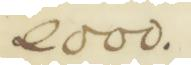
2000.
